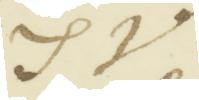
S V
